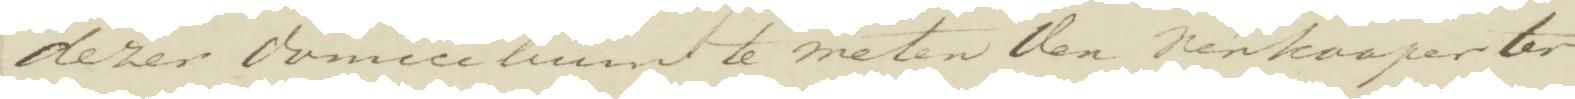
dezer domicilium te weten den verkooper ter
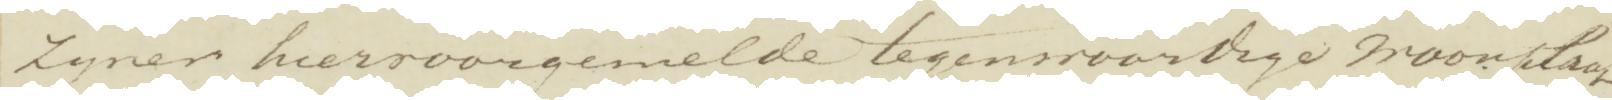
zyner hiervoorgemelde tegenwoordige woonplaat
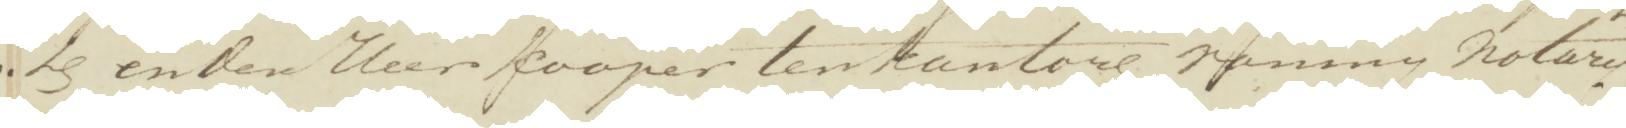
se en den Heer Kooper ten kantore van my notaris
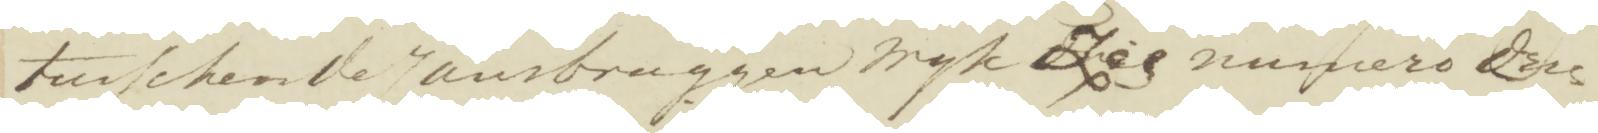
tusschen de Jansbruggen wyk Zes numero drie
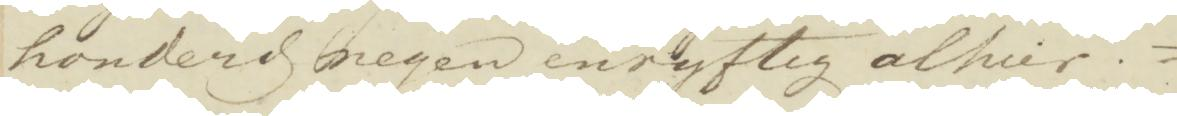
honderd negen en vijftig alhier.
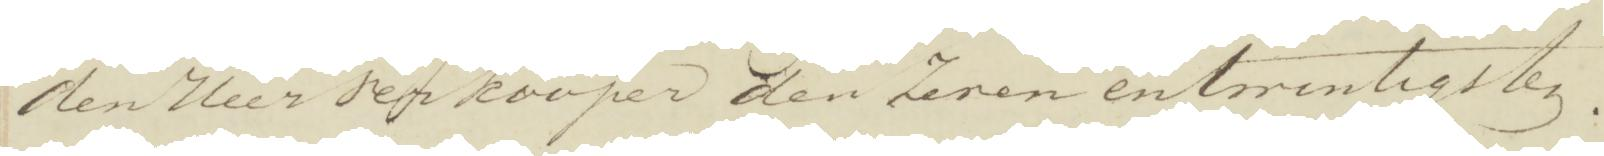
den Heer verkooper den Zeven en twintigsten.
